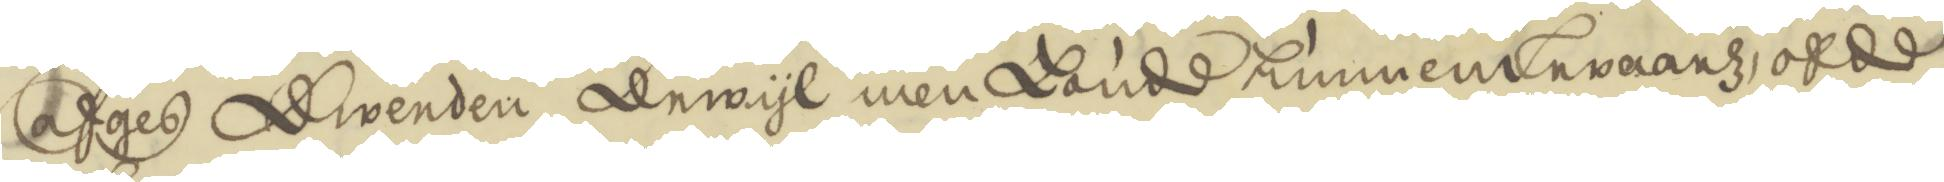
afges te werden terwijl men Zoude kunnen Ervaaren, of de
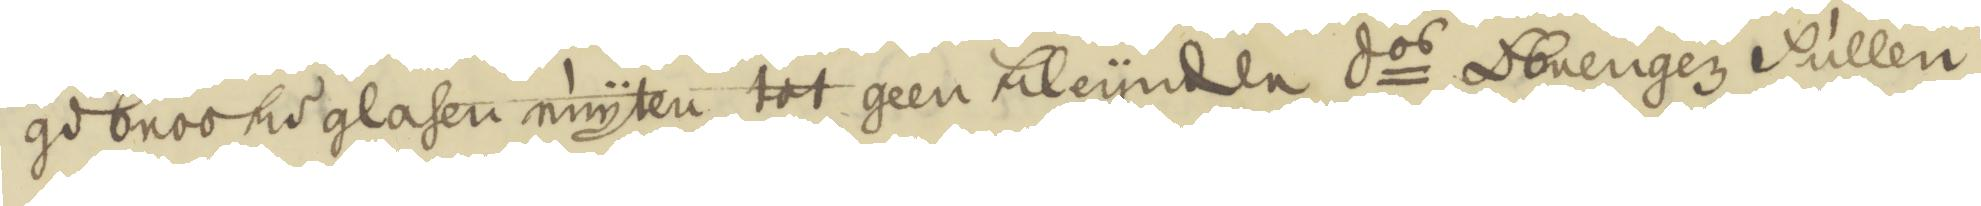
gebrooke glasen ruijten tot geen kleijnder d=os tebrengen Sullen
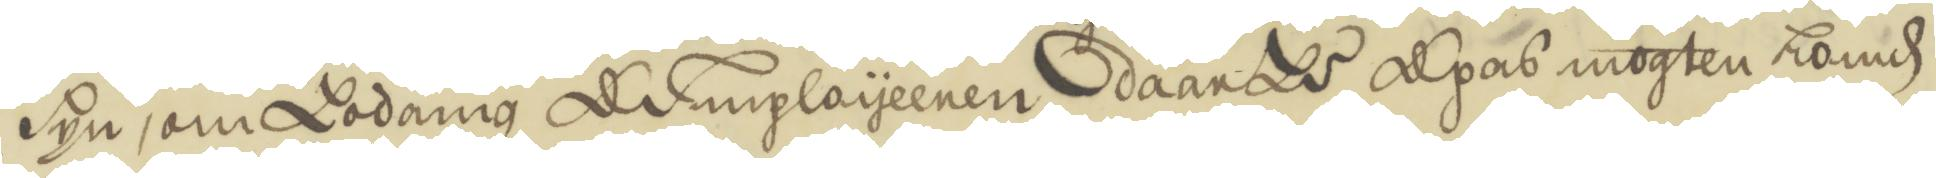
Syn, om zodanig te Emploijeeren daar Ze tepas mogten komen
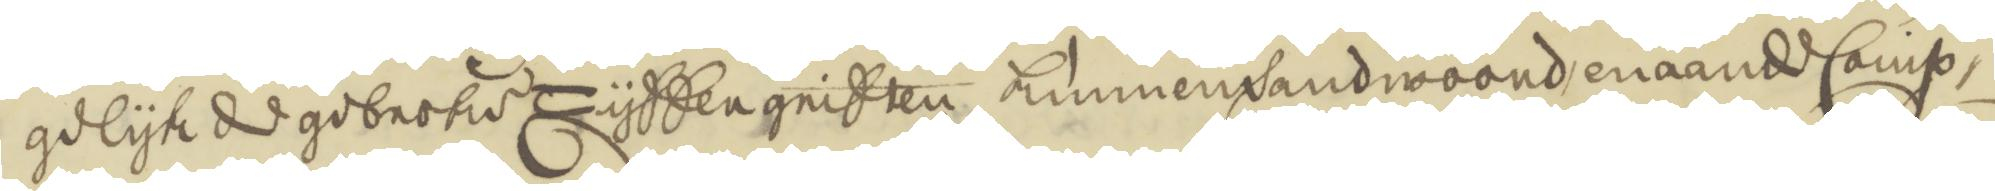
gelijk de gebroke Cijffer griften kunnen verandwoord, en aan de Comp„
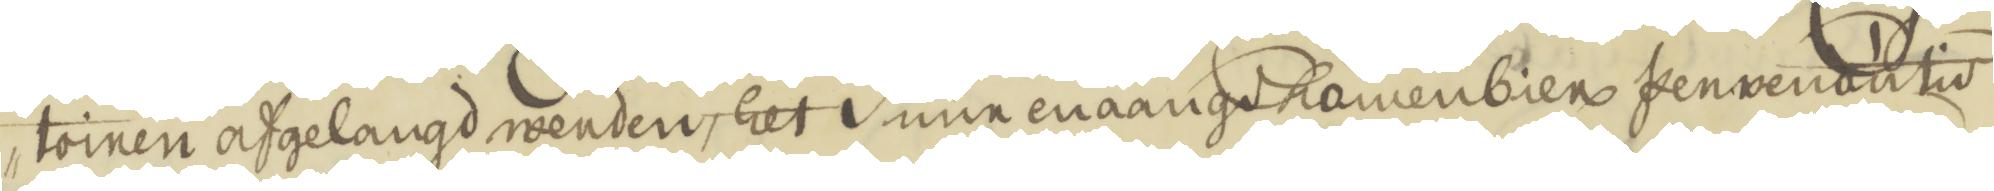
„toiren afgelangd werden, het Suur en aangekomen bier per vendutie
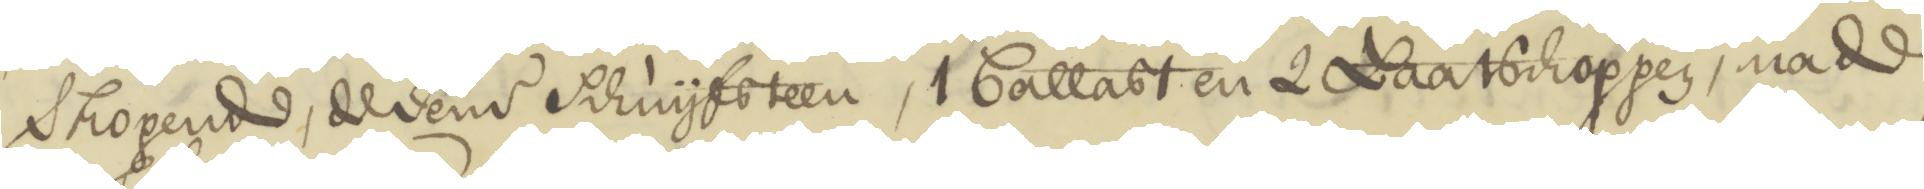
verkopende, de Eene Schuijfsteen, 1 ballast en 2 laatschoppen, na de
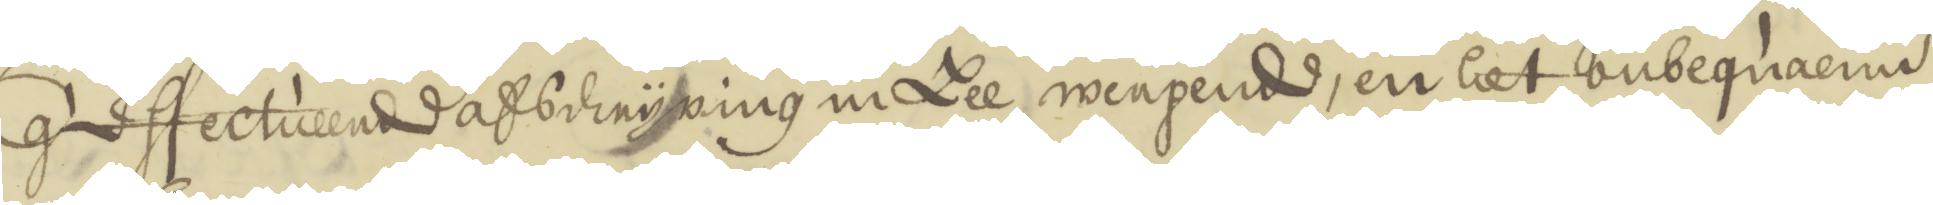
g’Effectueerde afschrijving in Zee werpende, en het onbequaeme
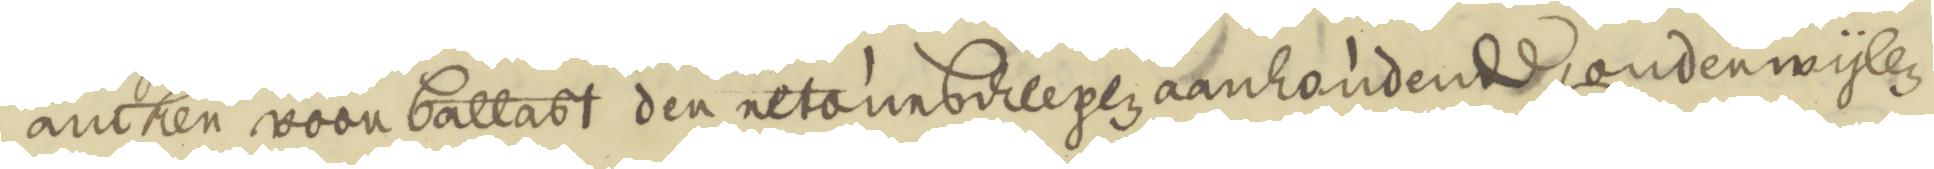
ancker voor ballast der retourschlepen aanhoudende onderwijlen
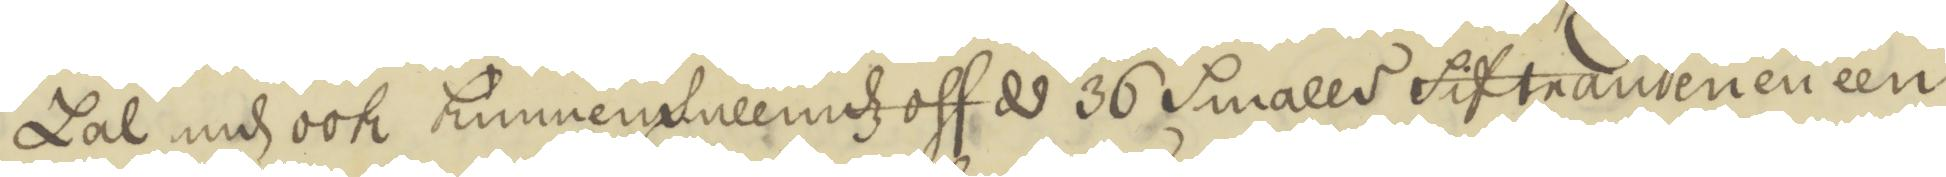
Zal men ook kunnen verneemen off de 36 Smalle siftranden en een
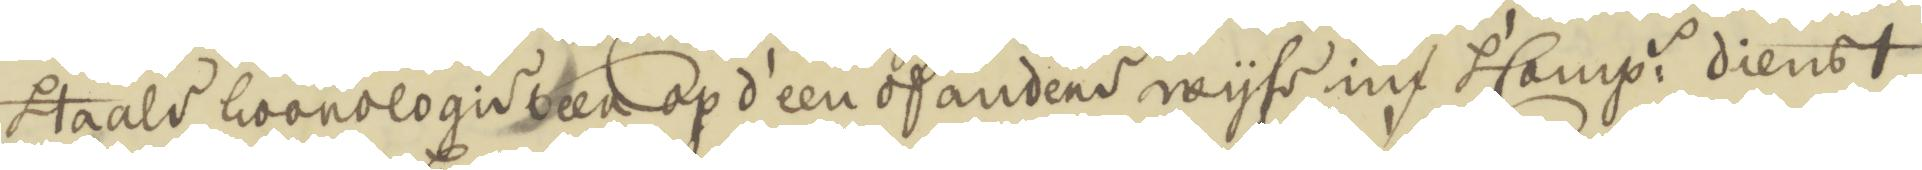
staale hoorologieveer op d’ een of andere wijse ins 'SComp.s dienst
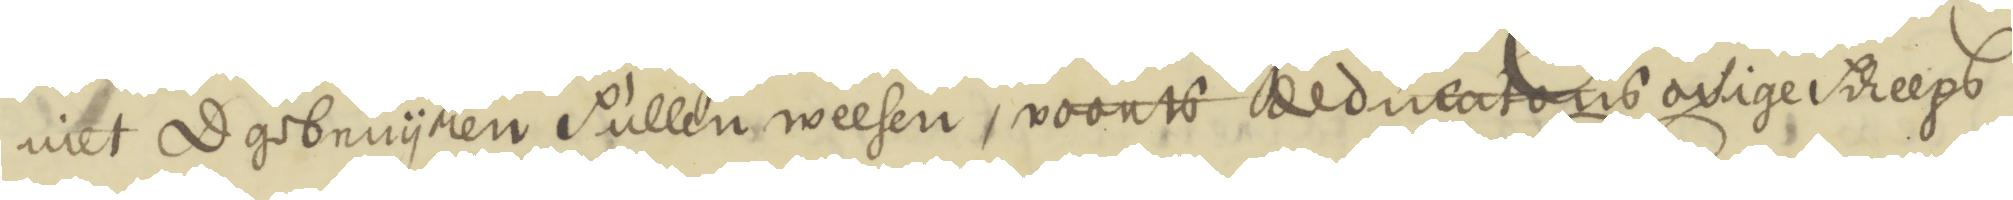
niet te gebruijken Sullen weesen, voorts de ducatons overige scheeps
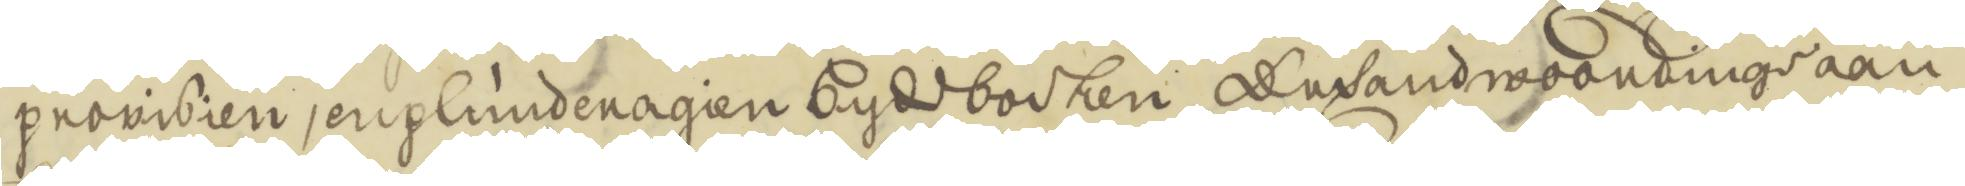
provisien, en plunderagien by de boeken ter verandwoordinge aan
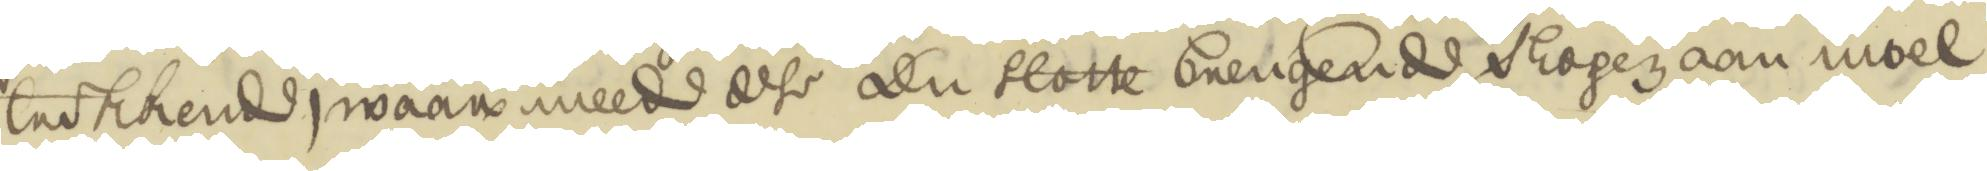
trekkende, waar meede dese ten slotte brengende verhopen aan uwel
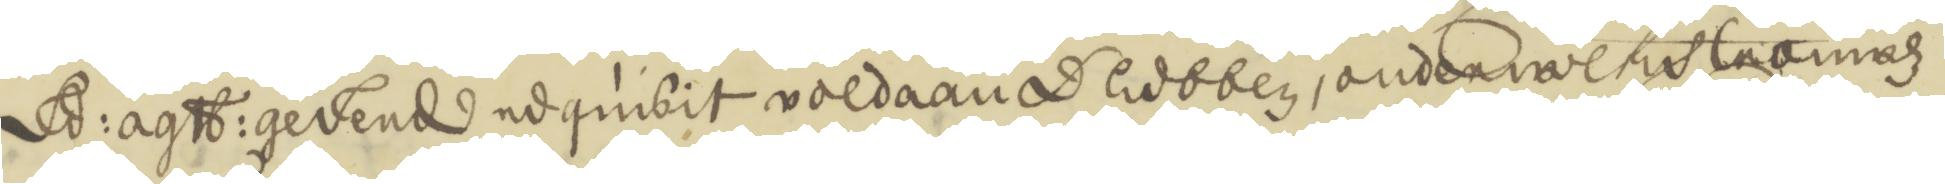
Ed: agtb: geeerde requisit voldaan te hebben, onderwelk vertrouwen
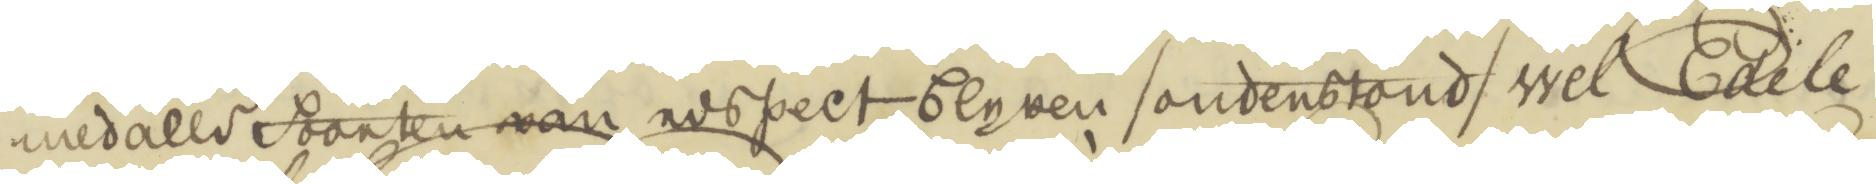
med alle Soorten van respect blyven /onderstond/ wel Edele
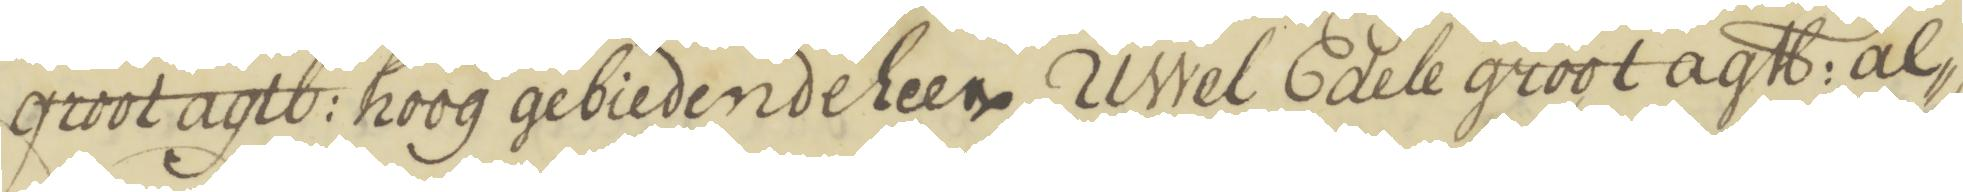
groot agtb: hoog gebiedende heer Uwel Edele groot agtb: al„
